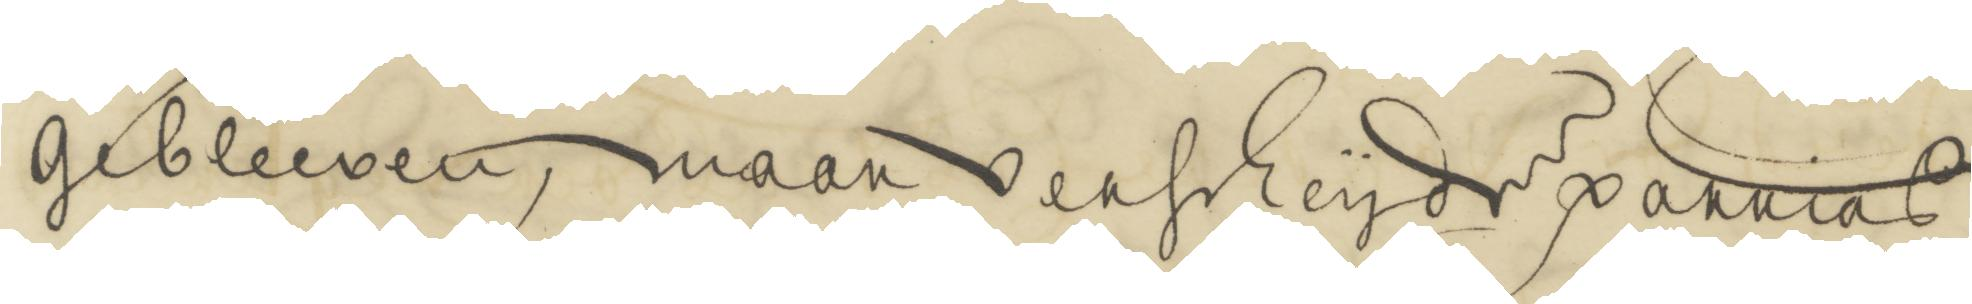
gebleeven, maar verscheijde parrias
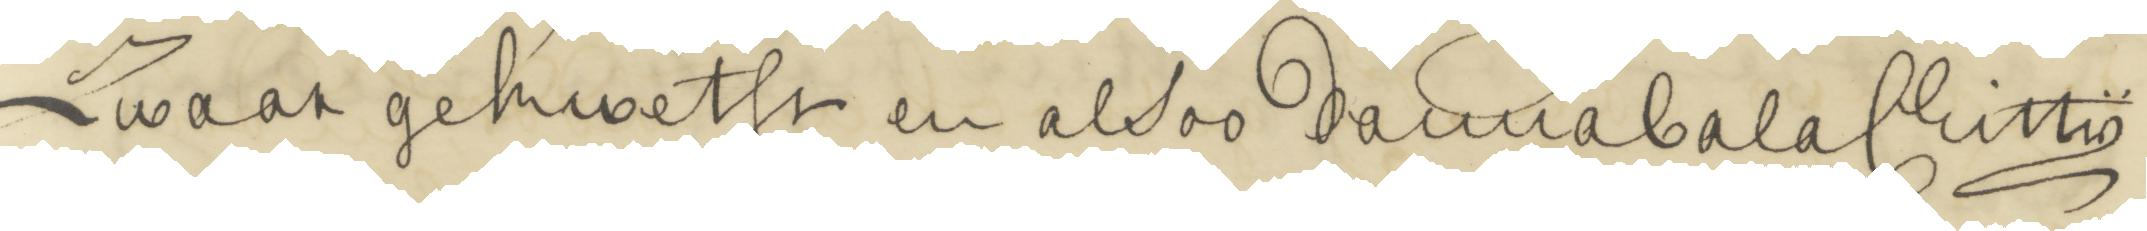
zwaar gekwetst en alsoo dannabalachittij
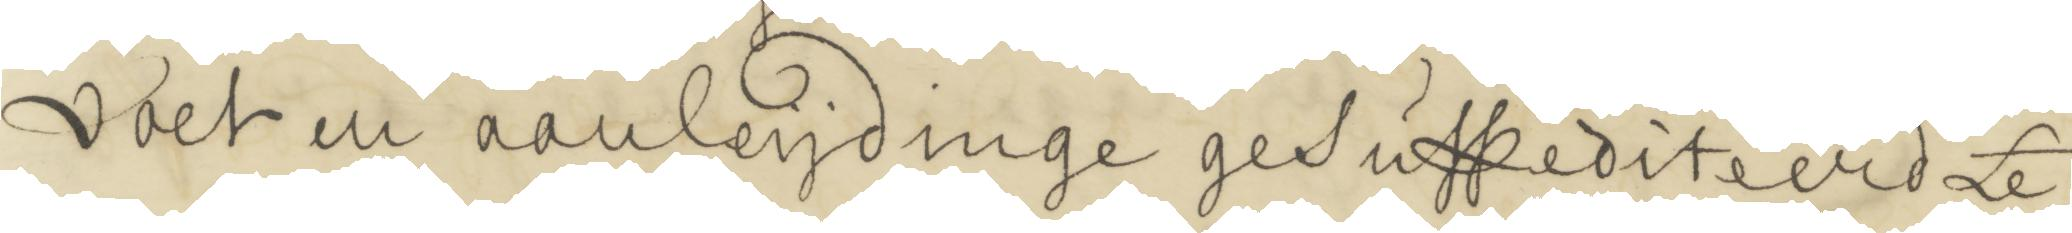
voet en aanleijdinge gesuppediteerd te
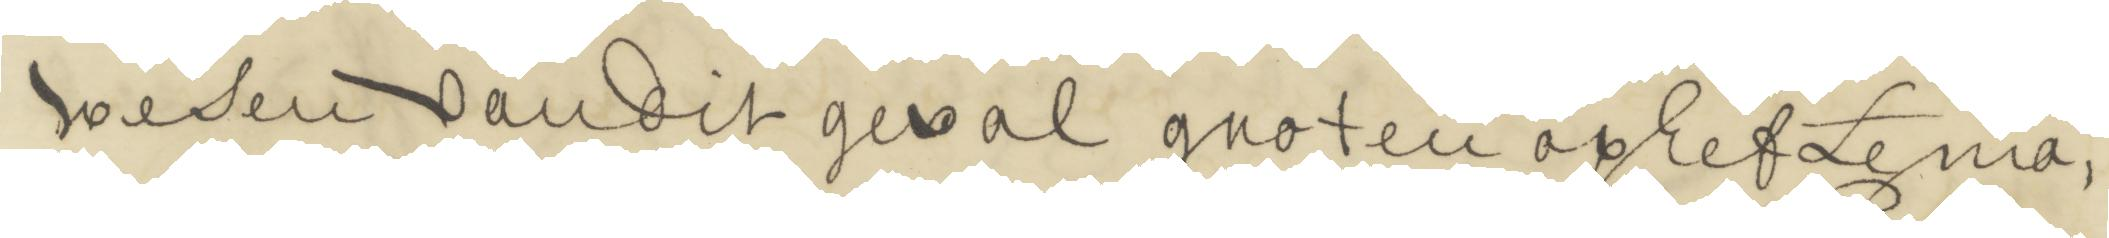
wesen vandit geval groten ophef te ma,
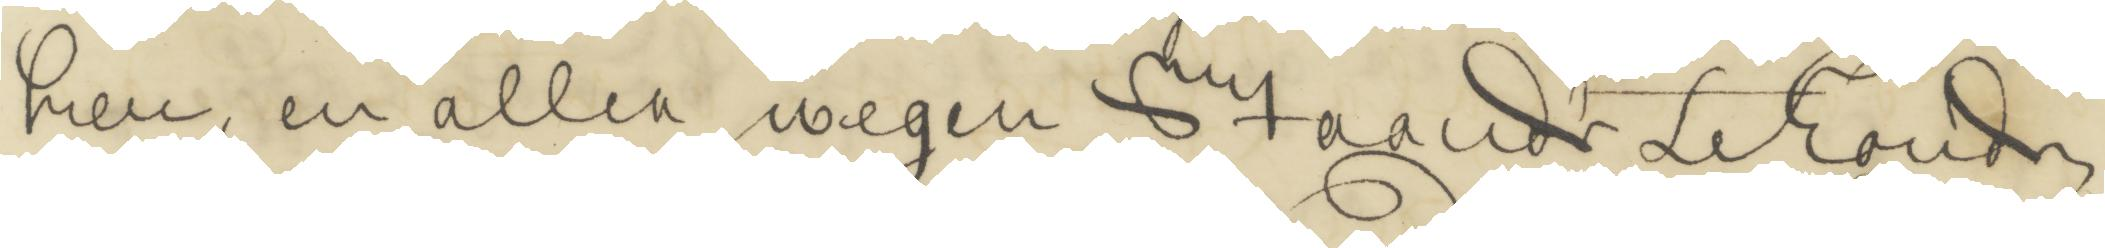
ken, en aller wegen staande tehouden
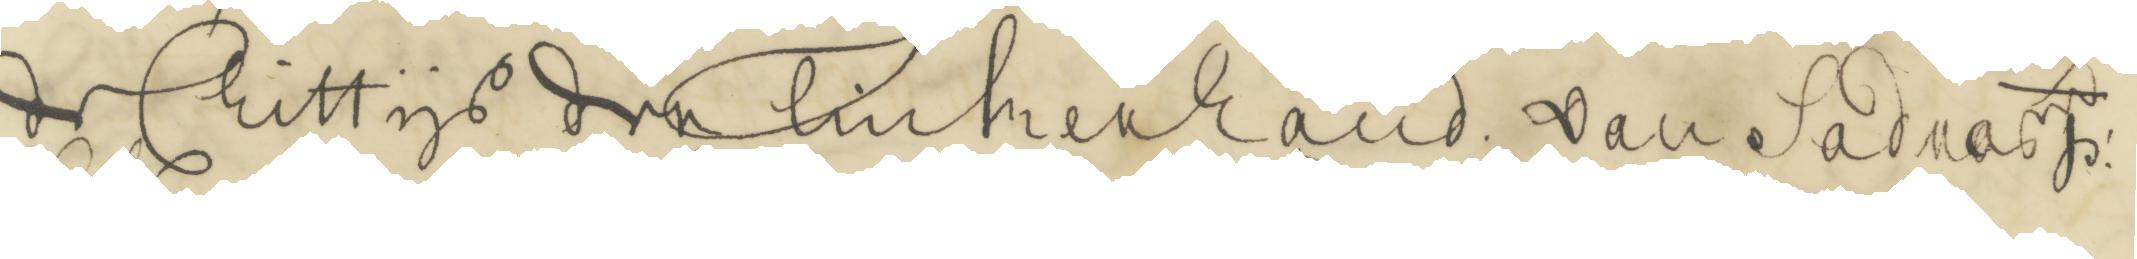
de Chittijs der linkerhand. van Sadrasp:
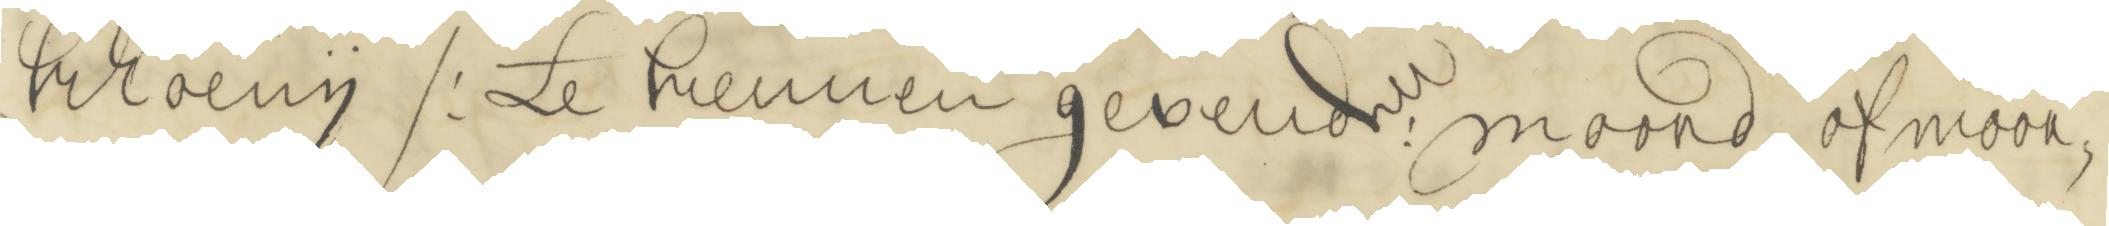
khoenij /:te kennen gevende: moord, of moor,
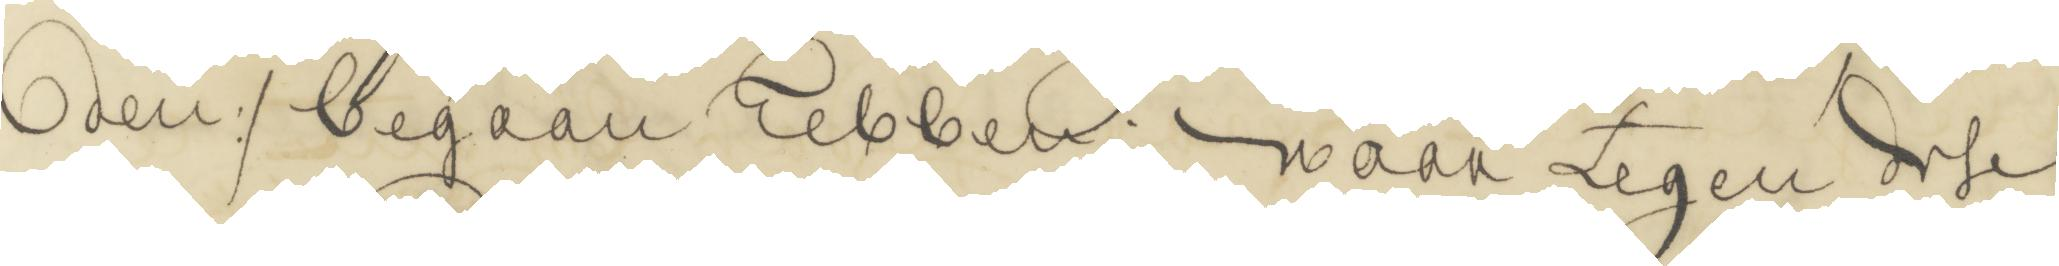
den:/ begaan hebben; waar tegen dese
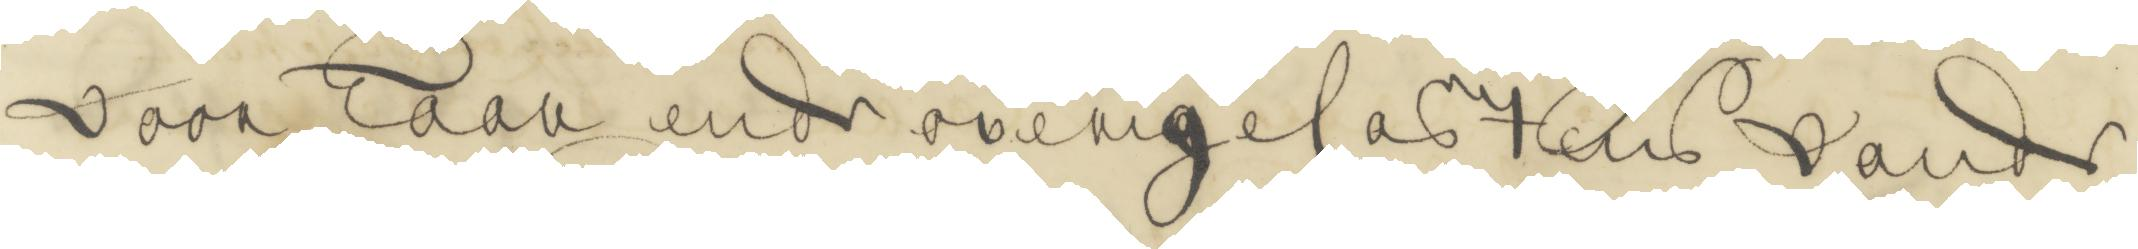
voor haar ende overige Castens vande
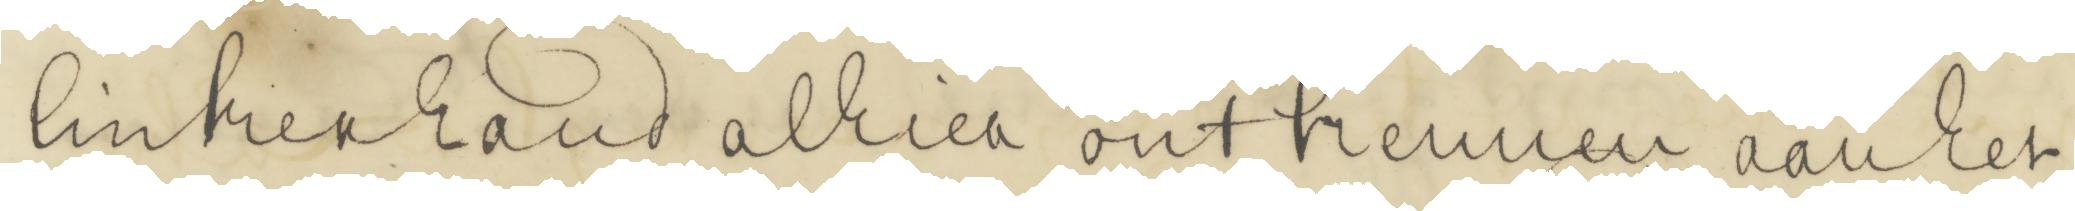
linkerhand alhier ontkennen aan het
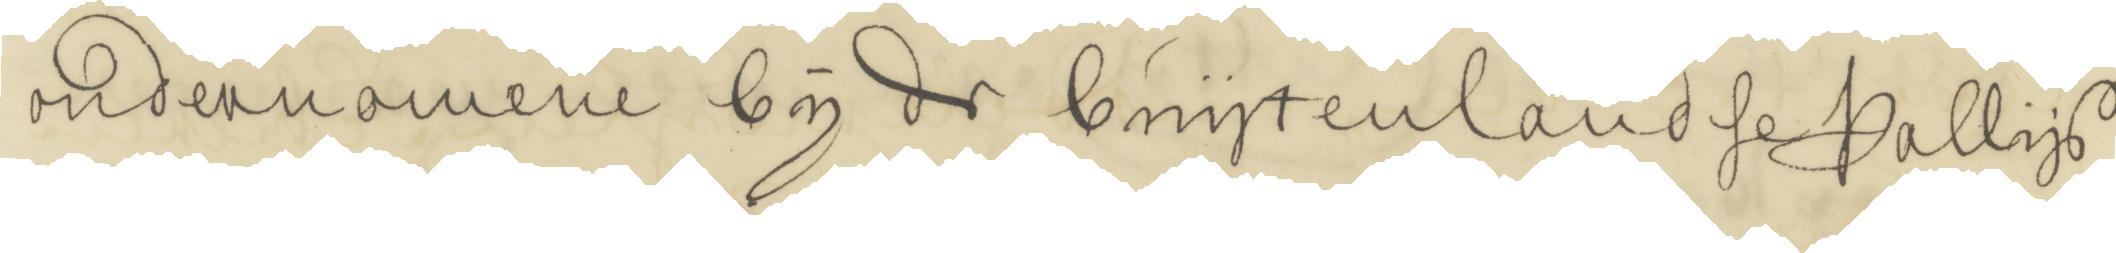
ondernomene bij de buijtenlandse pallijs
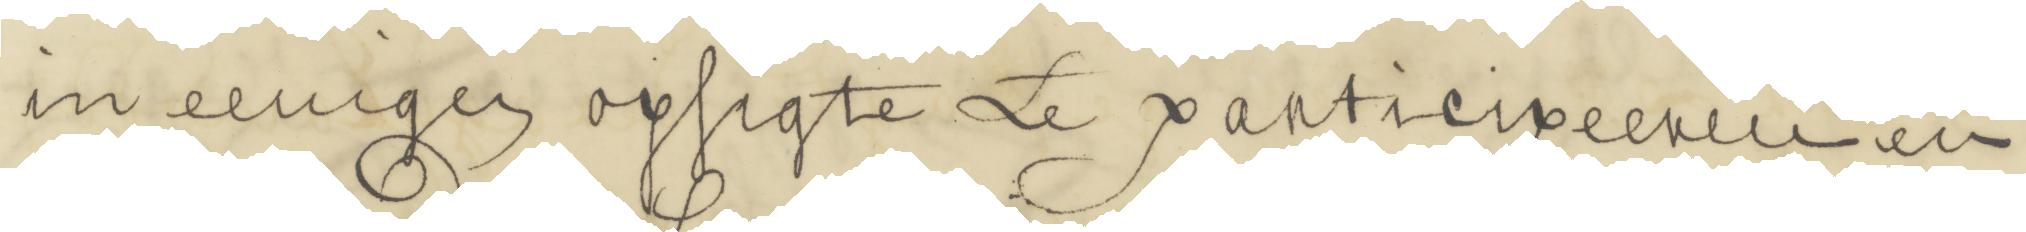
in eenigen opsigte te participeeren en
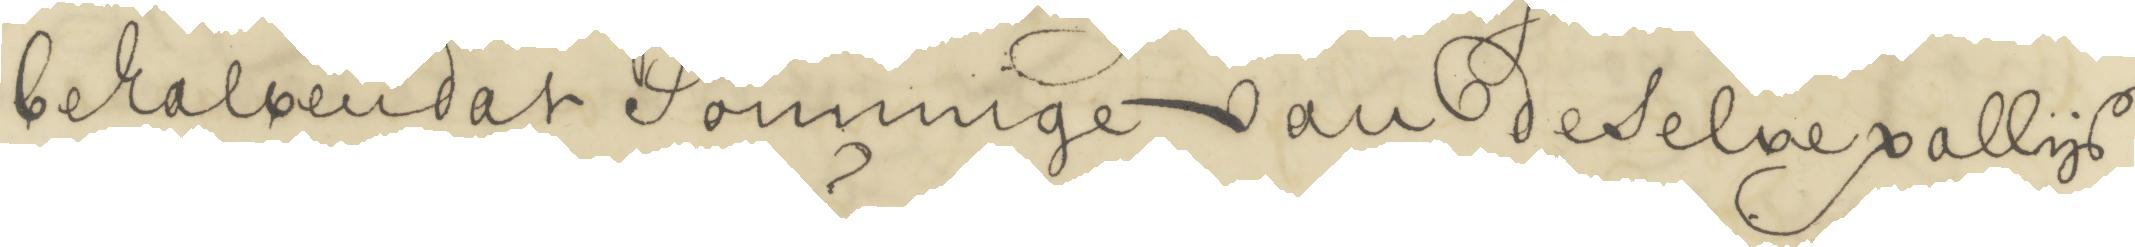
behalven dat sommige van deselve pallijs
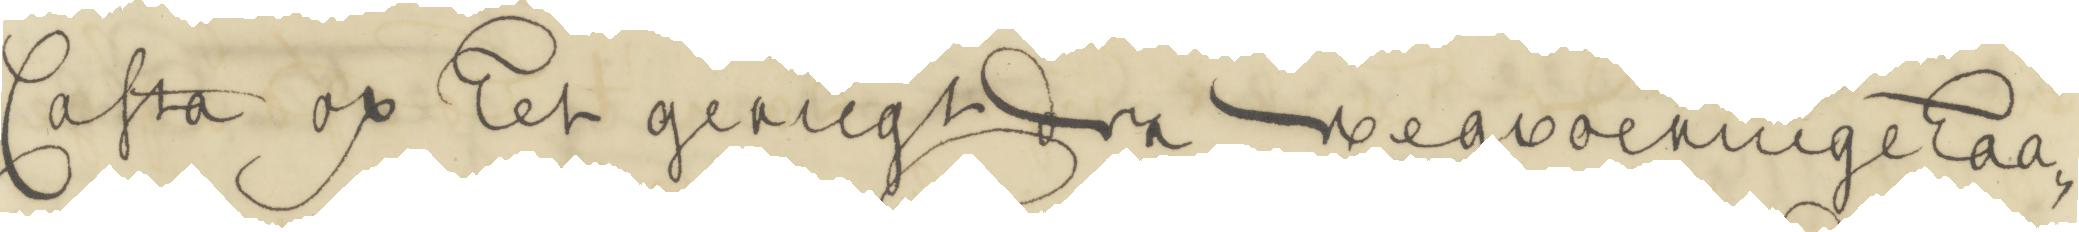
Casta op het gerugt der wegvoeringe haa„
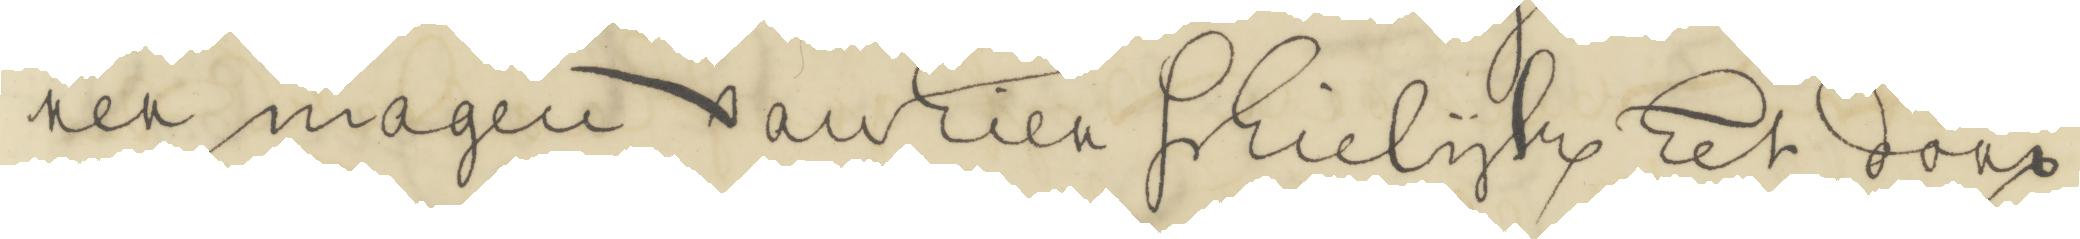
rer magen van hier schielijk het dorp
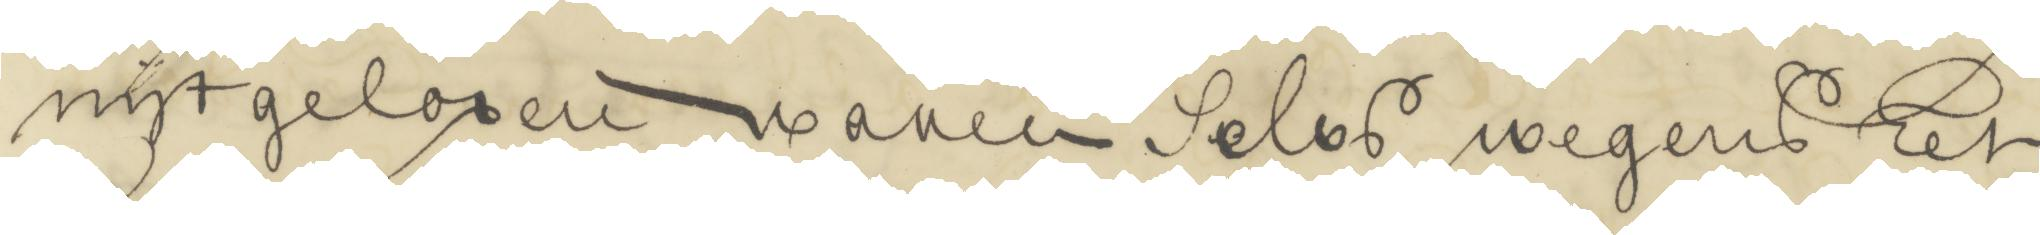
uijt gelopen waren selvs wegens het
